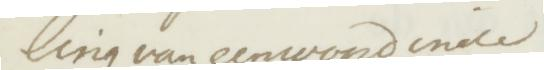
ling van eenwoord inde
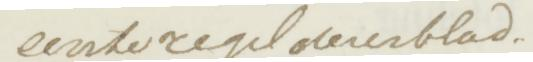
eerste regel dezerblad„
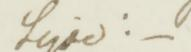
zijde:—
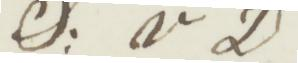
S: V D
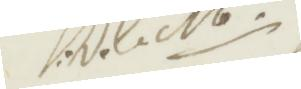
I:D.le M.
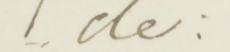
¶ de:
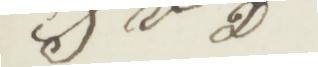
S v D
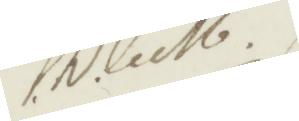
I.D.leM.
